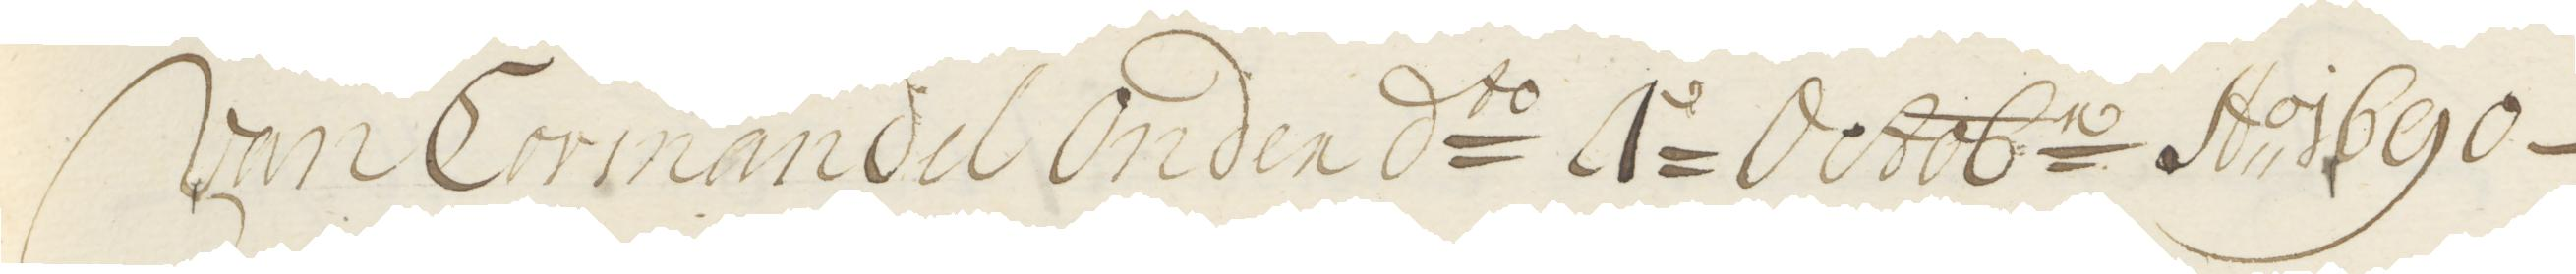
Van Cormandel onder d=to 4=e Octob=r A„o 1690—
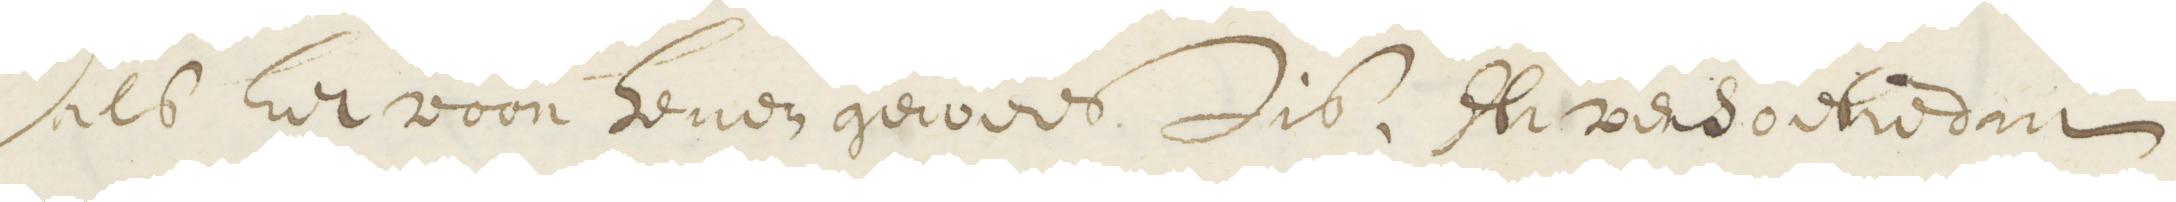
als het voor henen geweest is, Ik versoeke dan
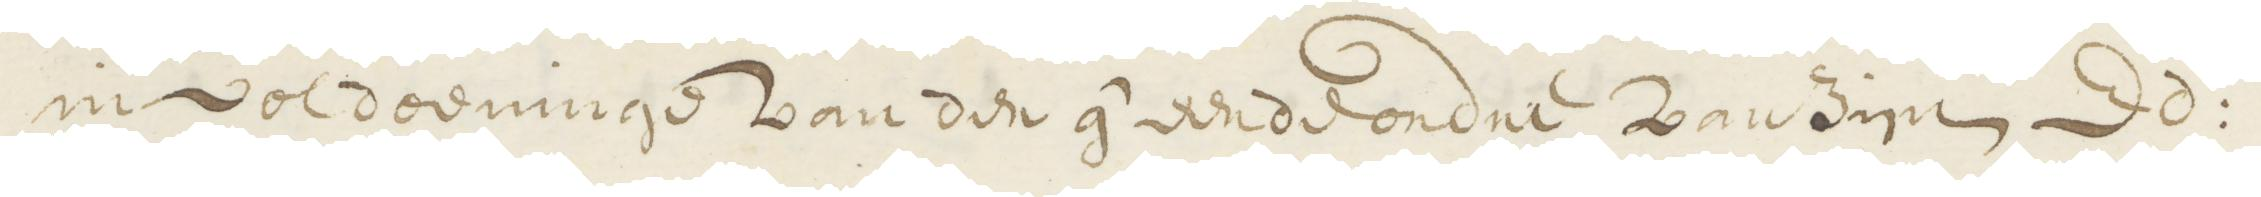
in voldoeninge van den g'eerde ordre van zijn Ed:'
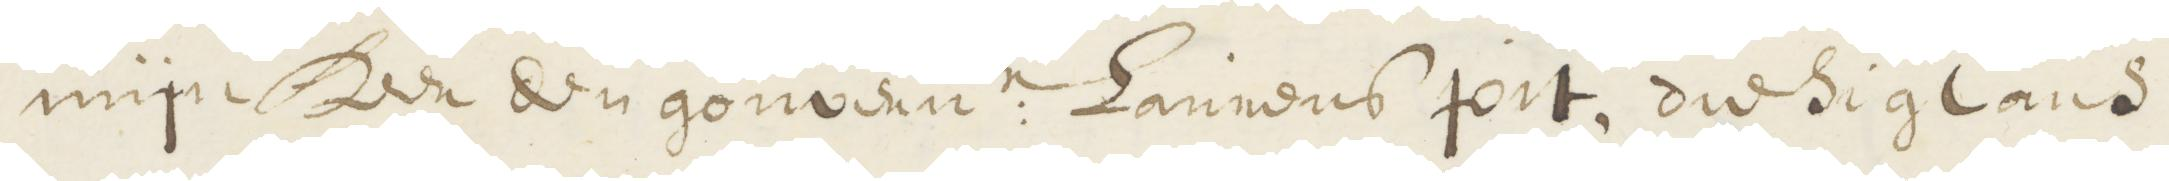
mijn Heer den gouvern:r Laurens pit, die sig tans
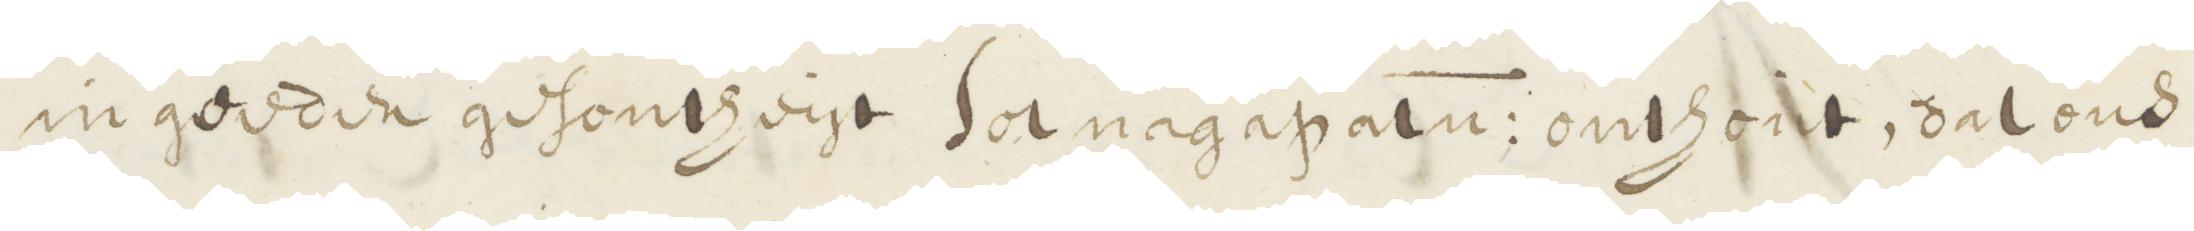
in goeder gesontheijt tot nagapatn: onthout, dat ons
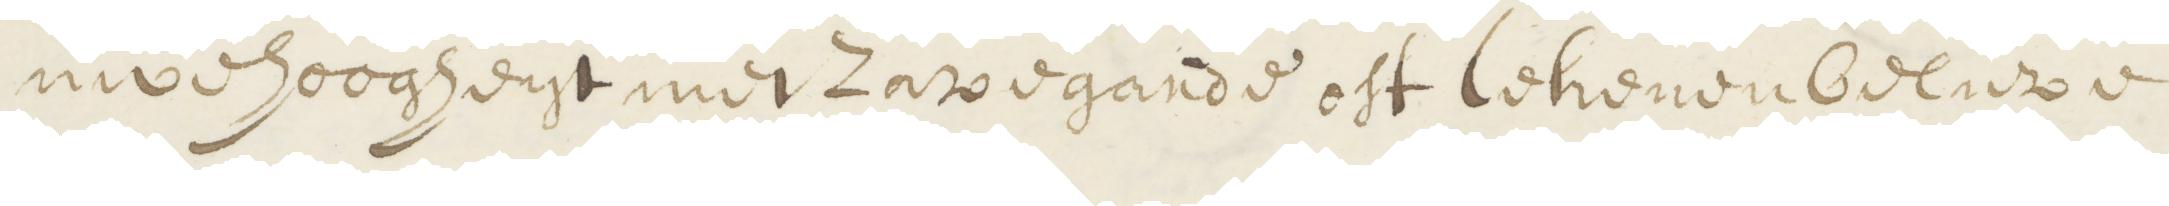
uwe hoogheijt met zavegarde oft tekenen believe
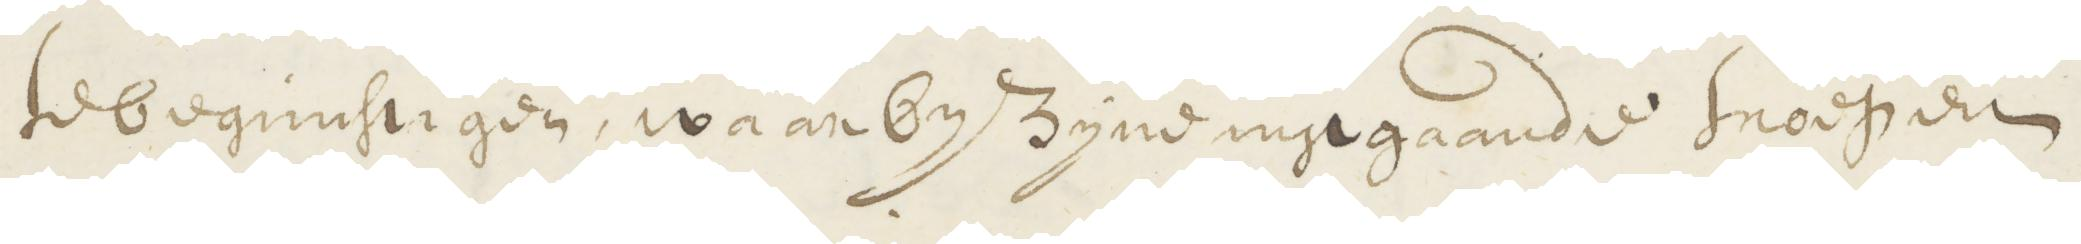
te begunstigen, waarby zijne uijtgaande troepen
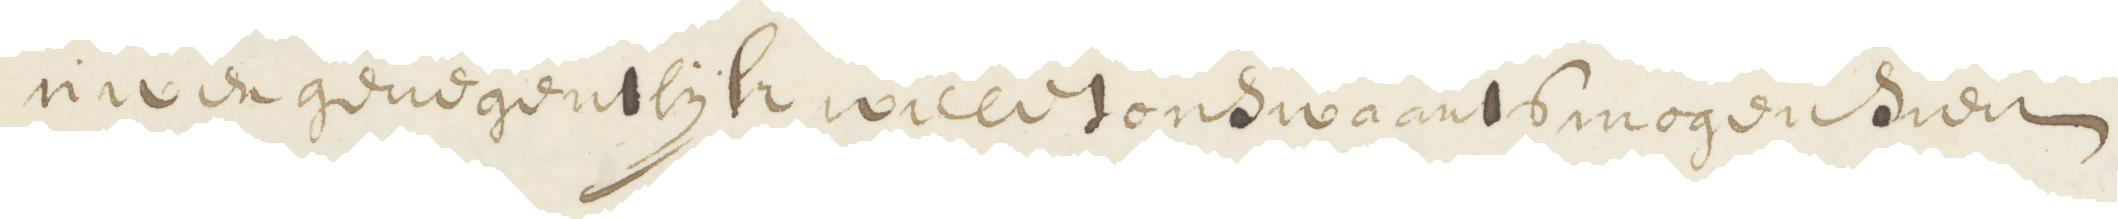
uwer genegentlijk wille t onswaarts mogen sien
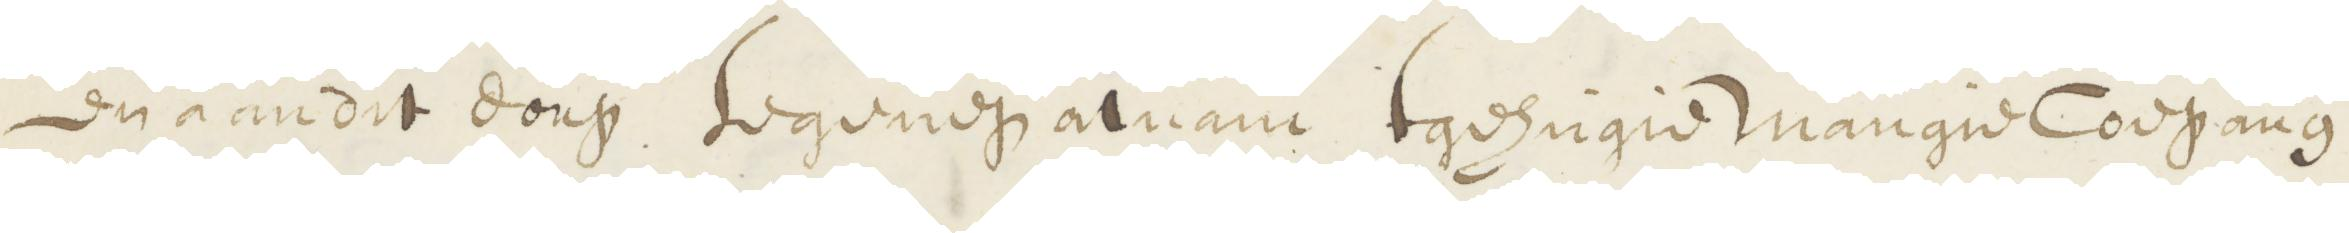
en aan dit dorp te genepatnam 'tgehugie mangie Coepang
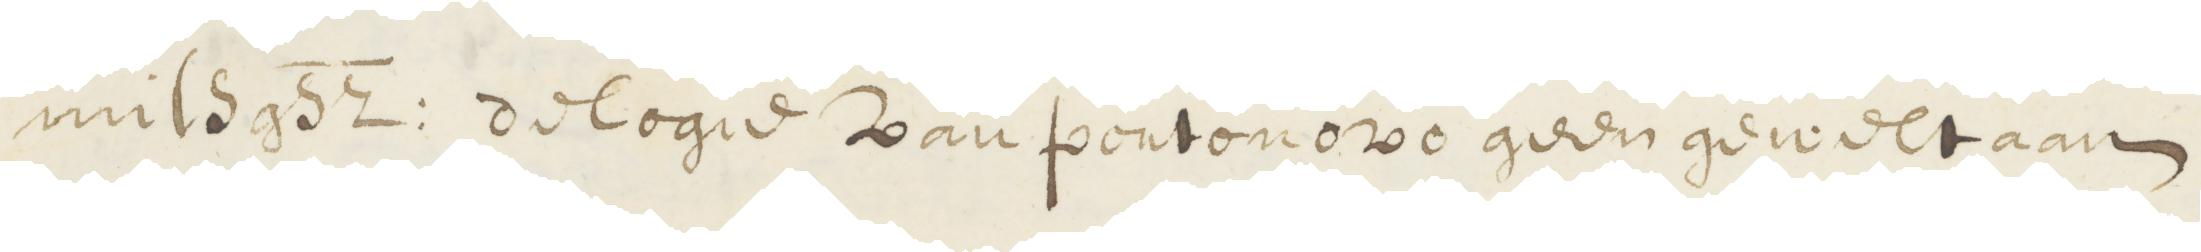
mitsgsz: de logie van portonovo geen gewelt aan
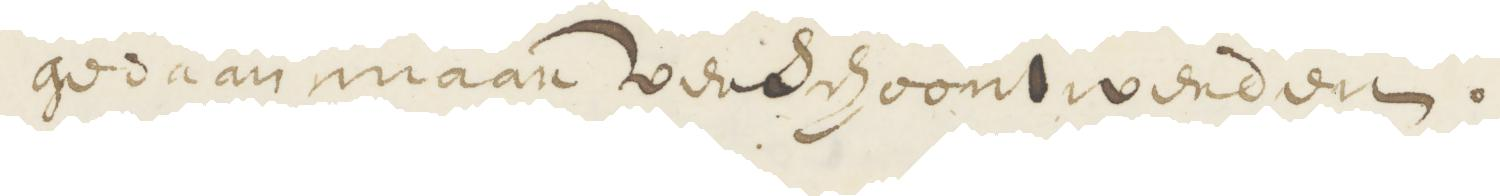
gedaan maar verschoont werden.
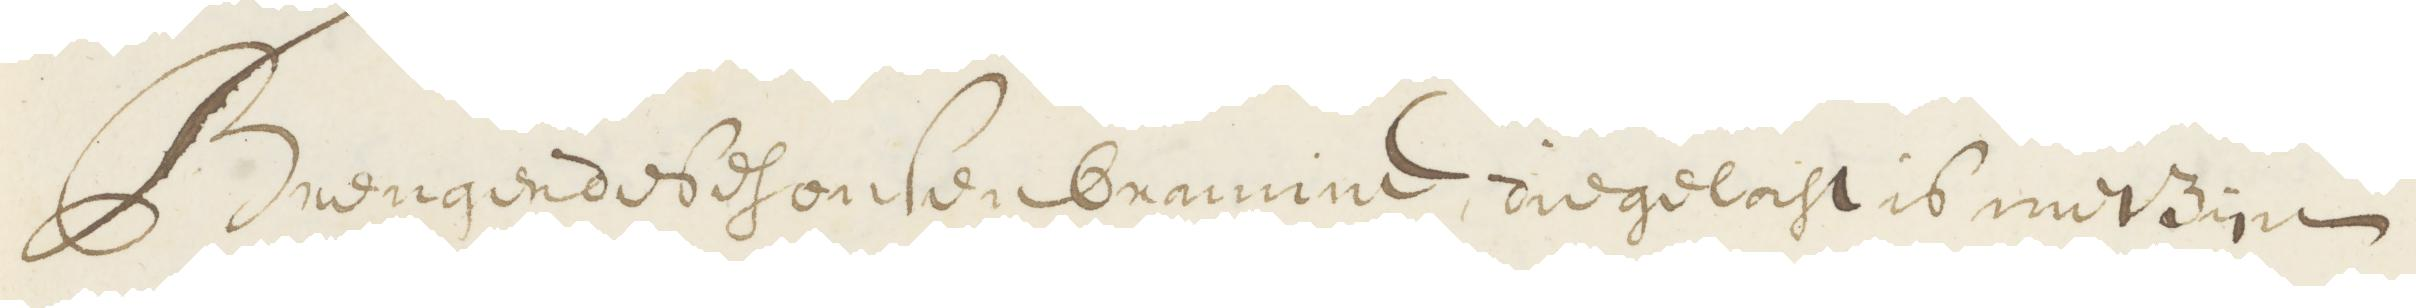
Brenger deses onsen bramine, die gelast is met zijn
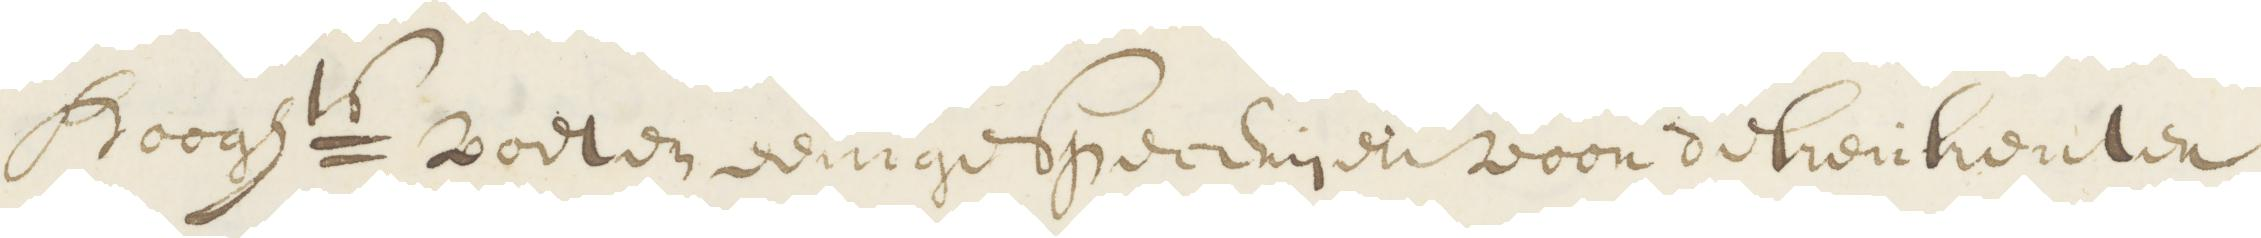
Hoogh=ts voeten eenige specerijen voor de keuken ter
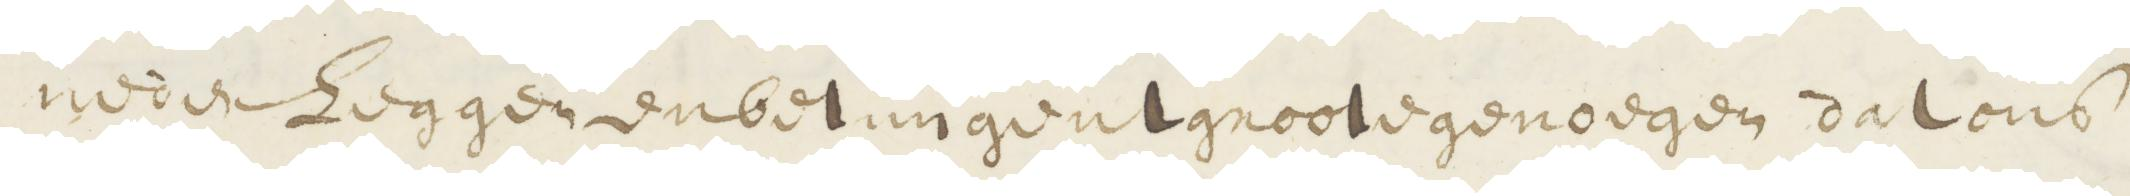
neder leggen en betuijgent groote genoegen dat ons
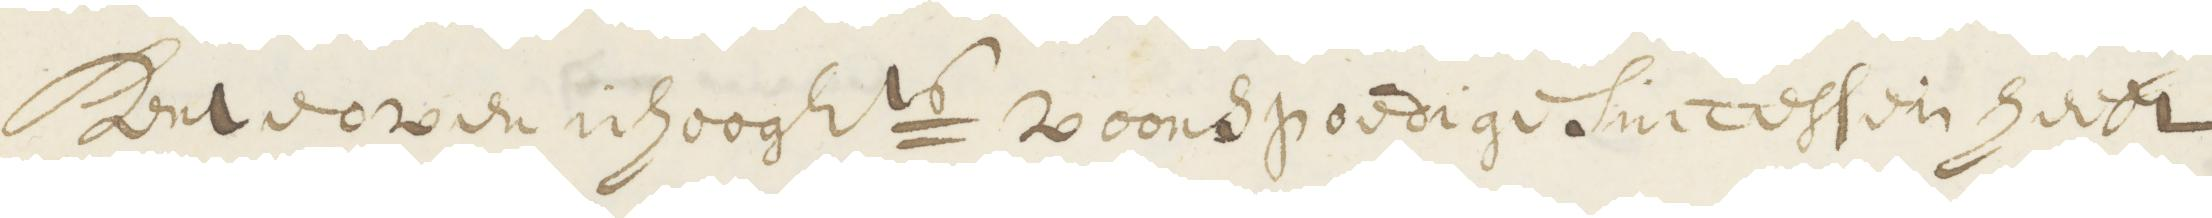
Herte over u hoogh=ts voorspoedige successen heeft
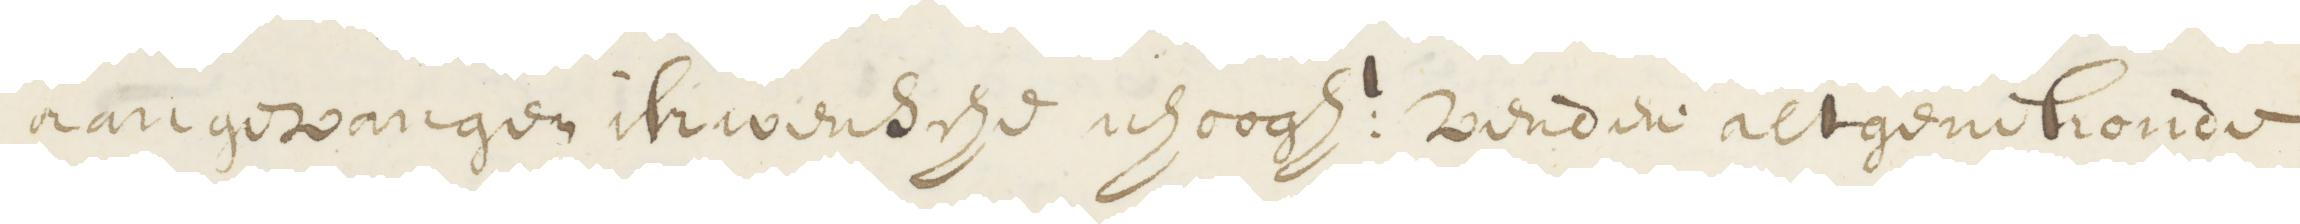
aan gevangen ik wensche uhoogh:t verder altgenekonde
